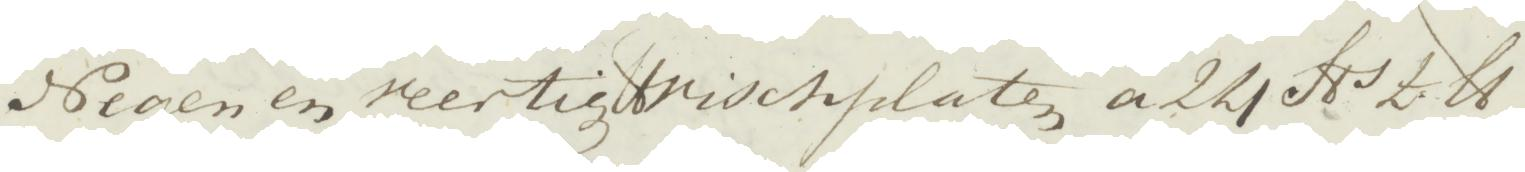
Negen en veertien lb vischplaten a 24 sts t lb
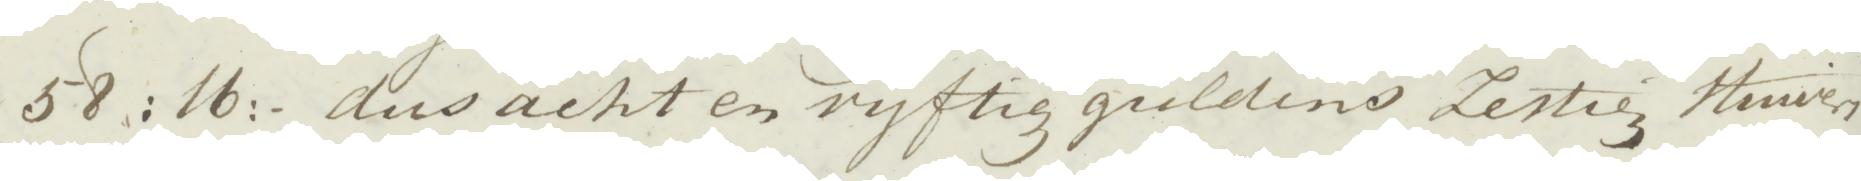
58 : 16:- dus acht en vyftig guldens zestien stuivers
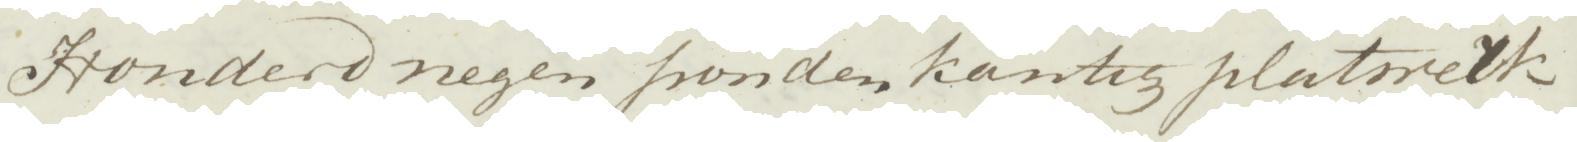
Honderd negen ponden kantig platwerk
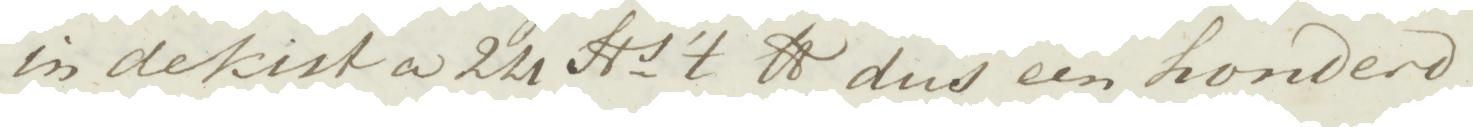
in dekist a 24 st=s 't lb dus een honderd
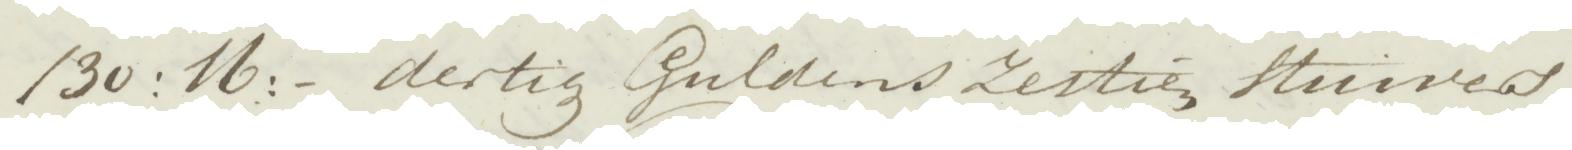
130 : 16:- dertig Guldens zestien stuivers
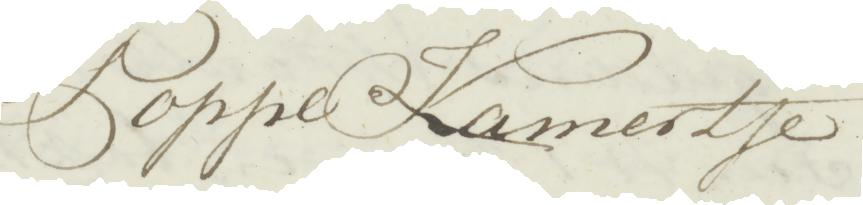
Poppe Kamertje
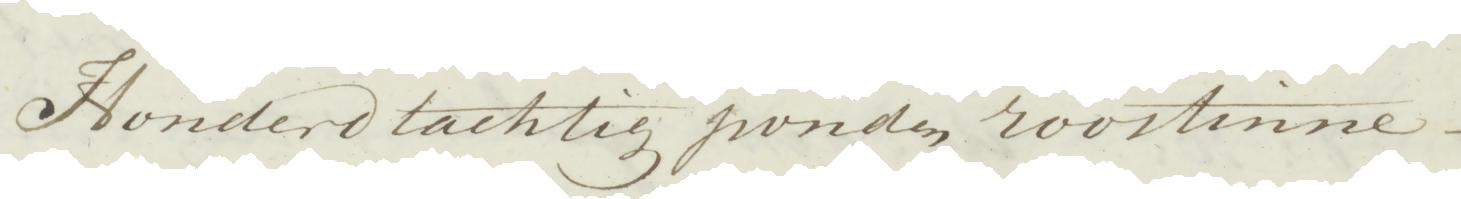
Honderd tachtig ponden roostinne
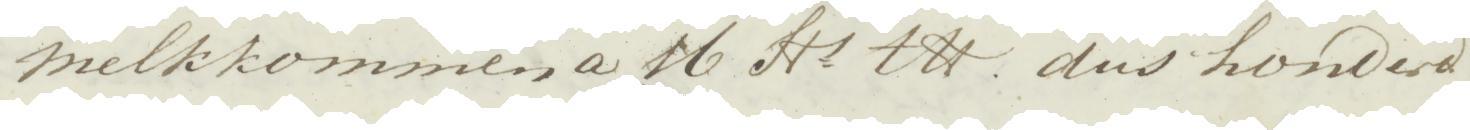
melkkommen a 16 st=s tlb. dus honderd
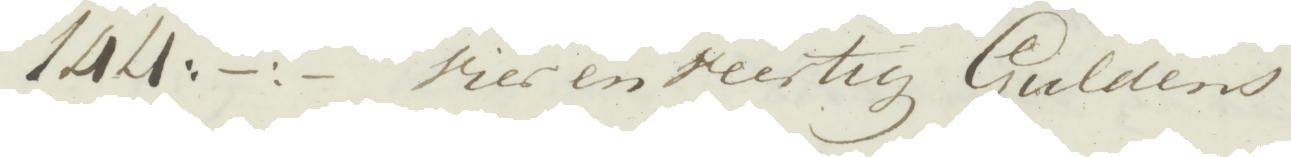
144:—:— vier en veertig Guldens
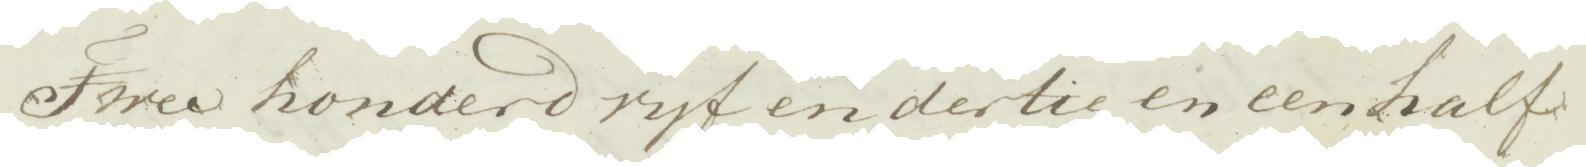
Twee honderd vyf en dertig en een half
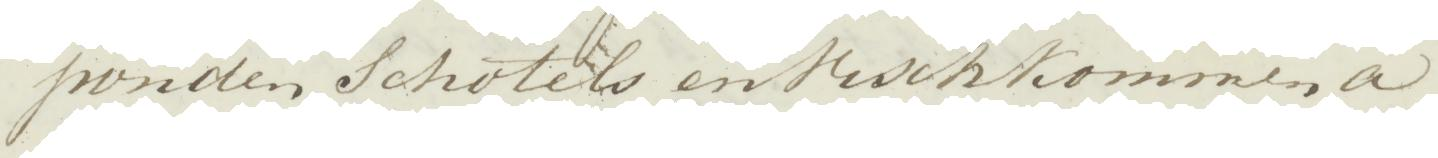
ponden Schotels en Vischkommen a
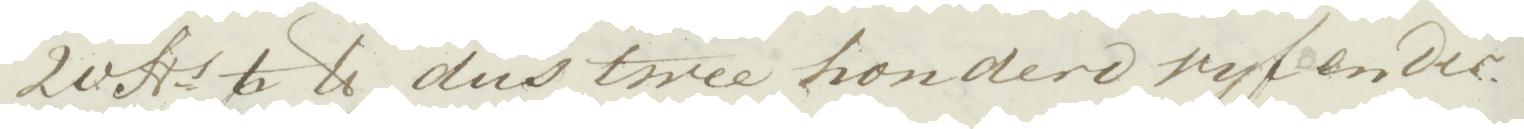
20 st=s t lb, dus twee honderd vijf en der.
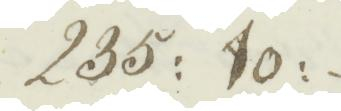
235: 10:
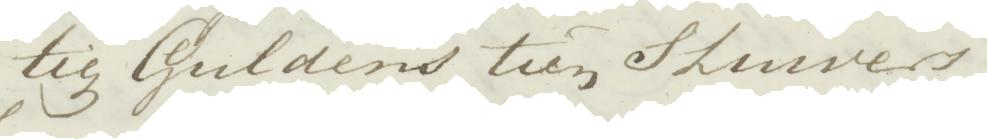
tig Guldens tien stuivers
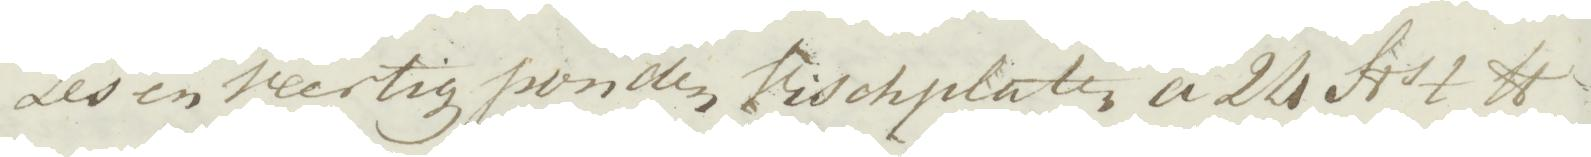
zes en veertig ponden Vischplaten a 24 sts t lb
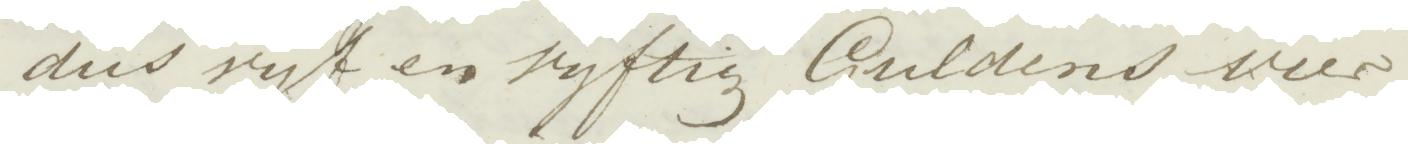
dus vyf en vijftig Guldens vier
